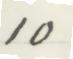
0
